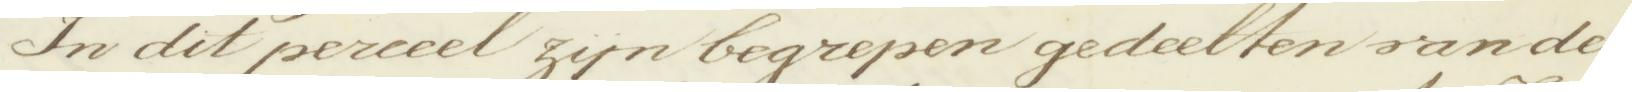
In dit perceel zijn begrepen gedeelten van de
